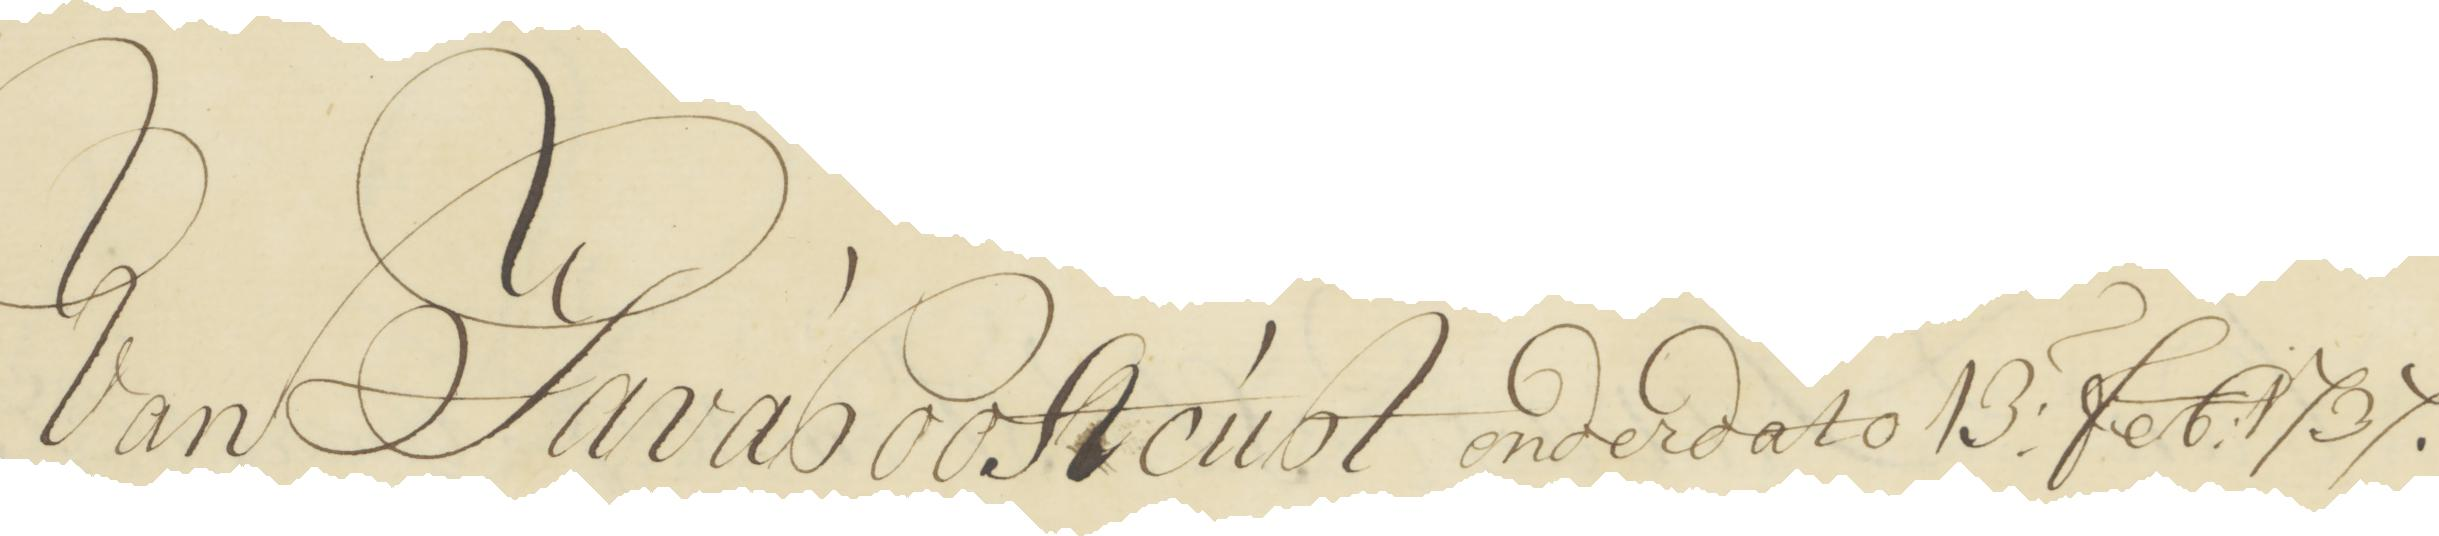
Van Iava's oostcust onder dato 13:' feb: 1737.
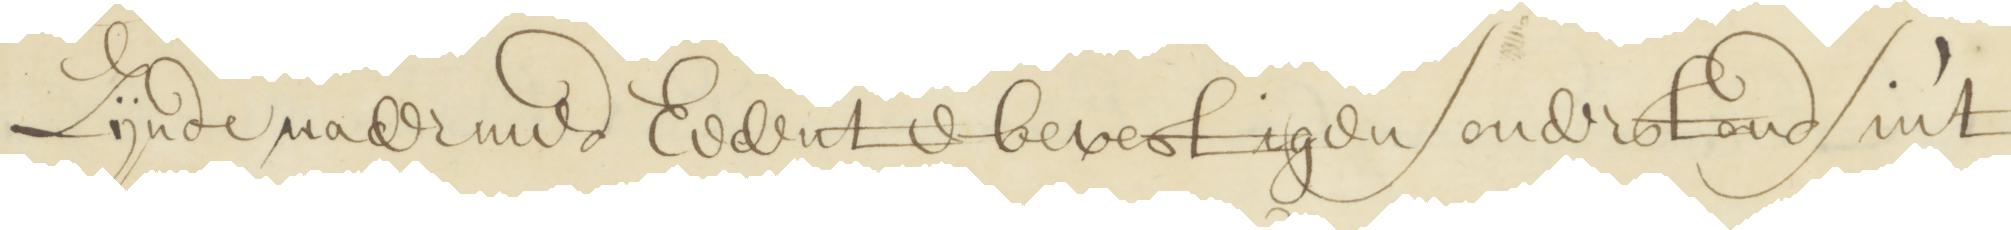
zijnde nadermed Eedente bevestigen /onderstond/ in’t
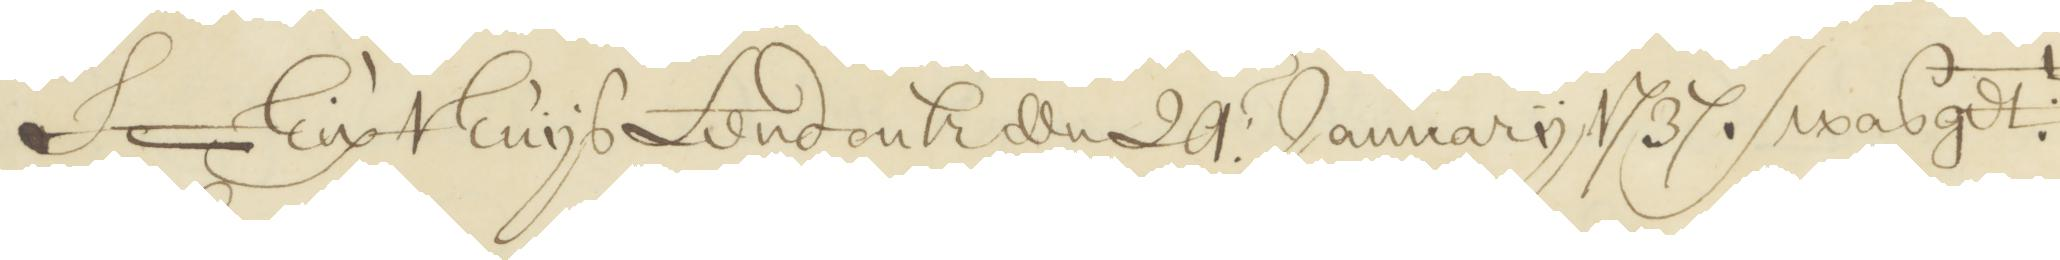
schip 'thuijs tendonk den 24:' Januarij 1737. /was get:t
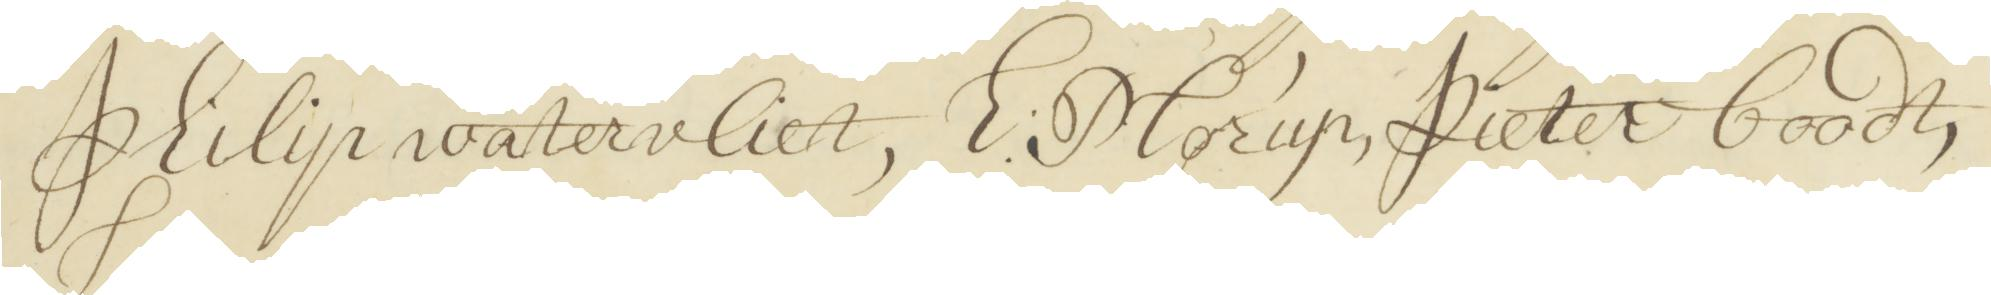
Philip watervliet, h: Morup, Pieter boodt,
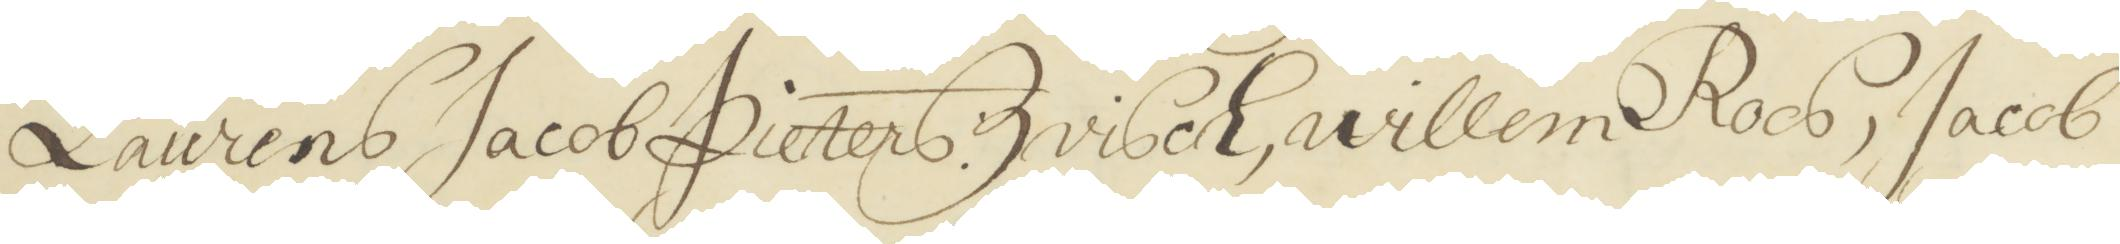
Laurens Jacob Pietersz: visch, willem Roos, Jacob
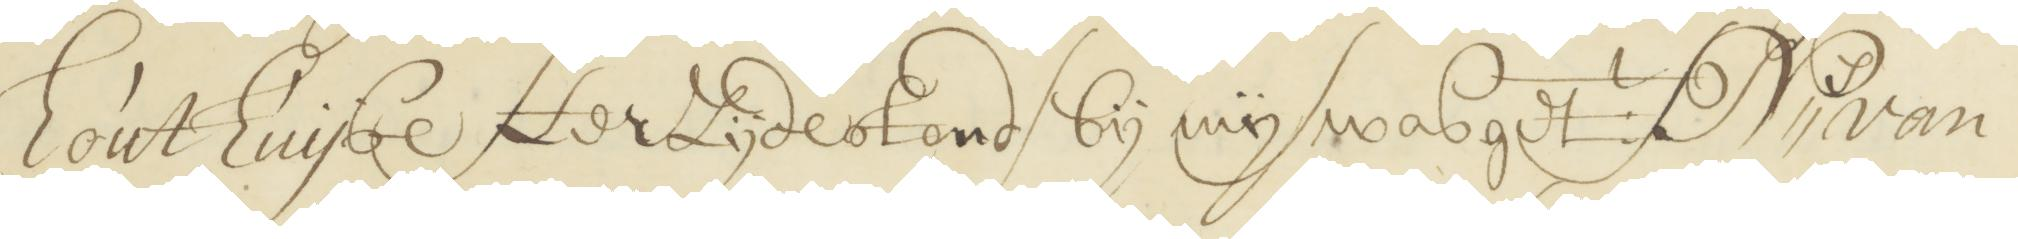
hout huijse /ter zijdestond/ bij mij /was get:t/ N„s van
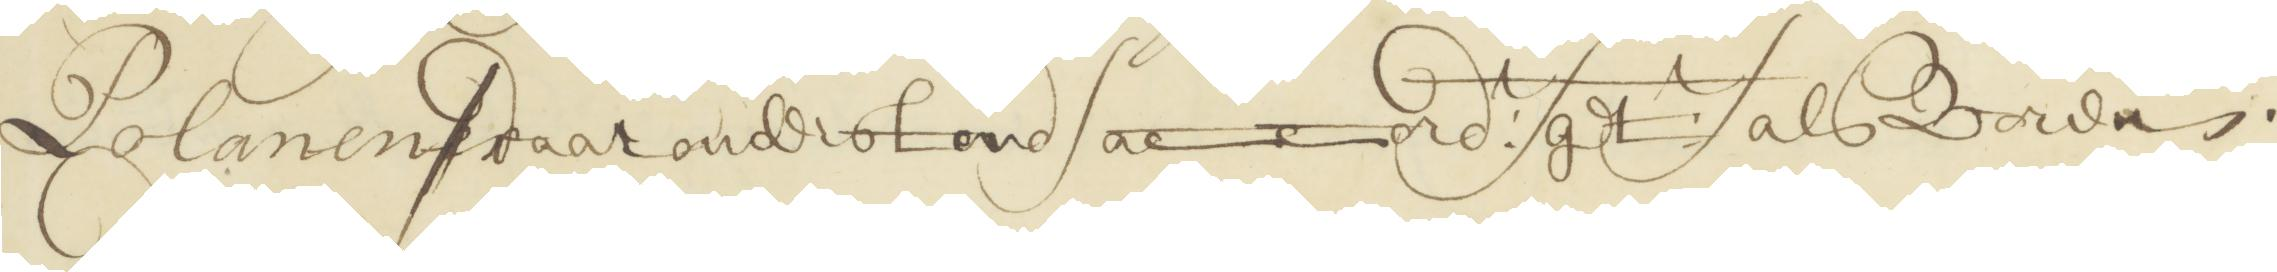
Polanen /daar onderstond/ accord:t /get:t/ als Boven.
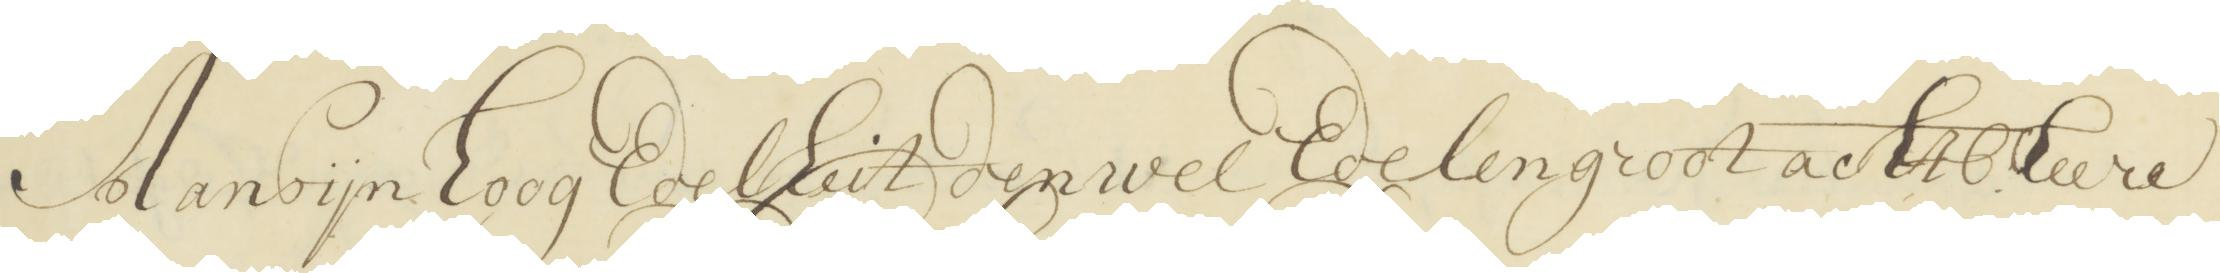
Aan sijn hoog Edelheit den wel Edelen groot achtb: heere
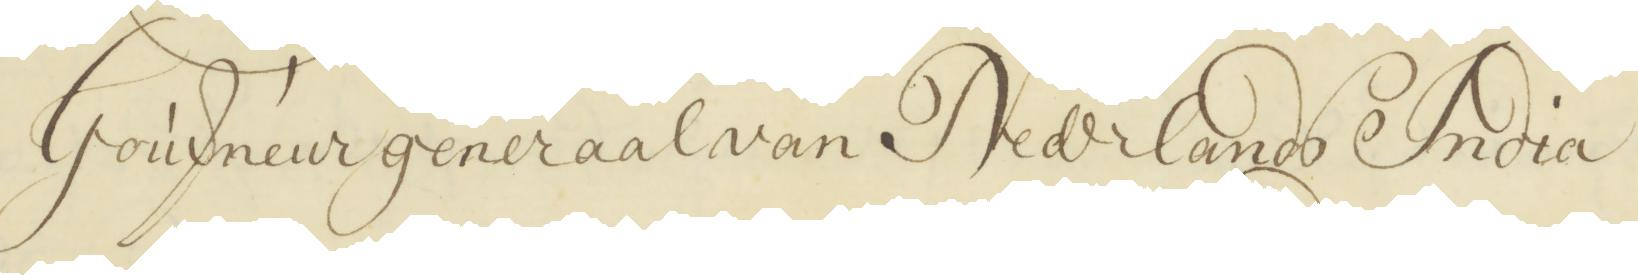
Gouverneur generaal van Nederlands India
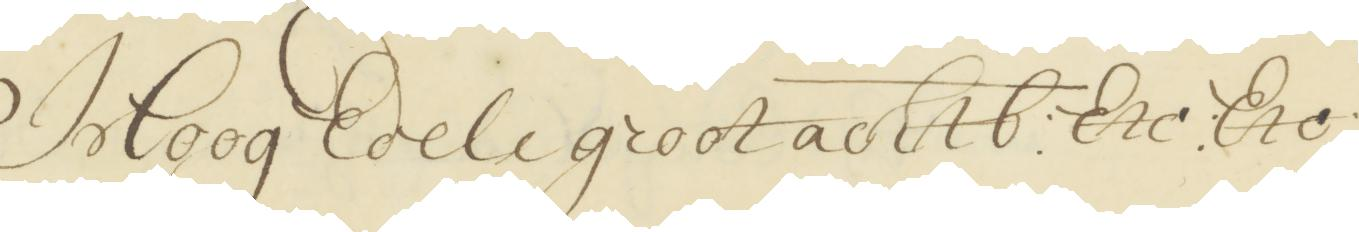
Hoog Edele groot achtb: Etc: Etc
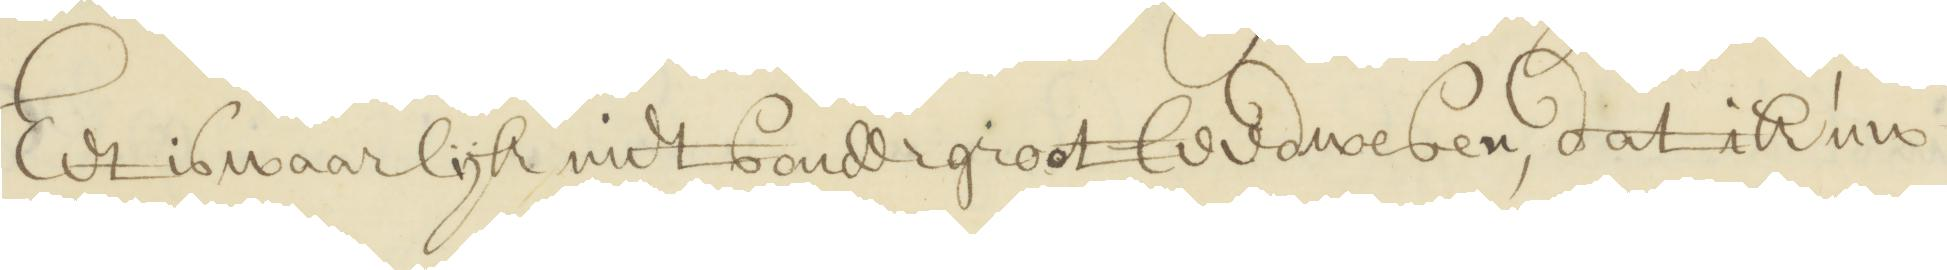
het is waarlijk niet sonder groot leedwesen, dat ik uw
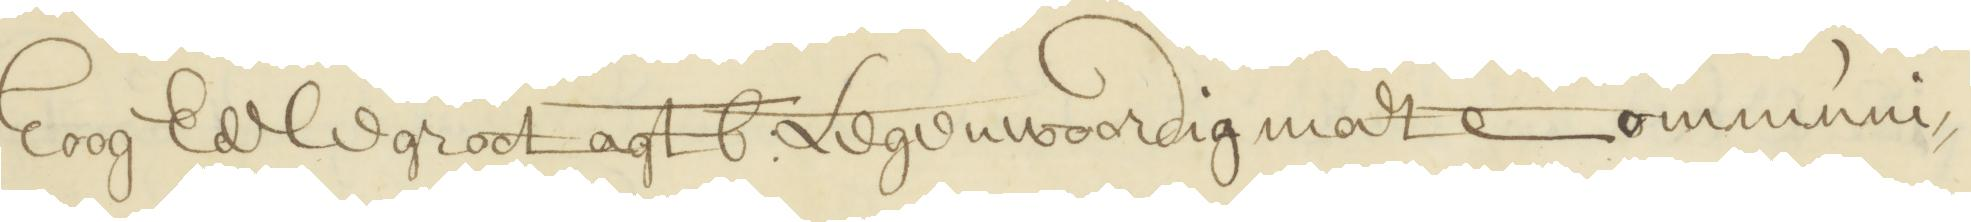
hoog Edele groot agtb: tegenwoordig moet communi„
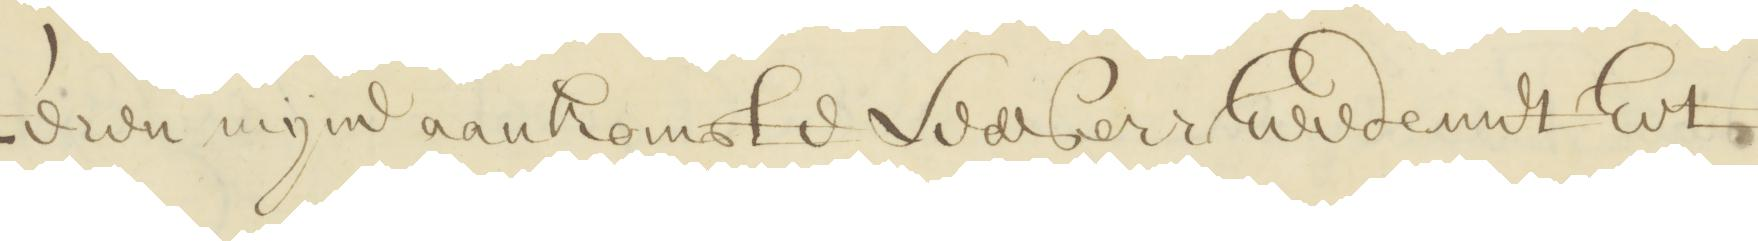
„ceren mijne aan komste te deserrheede met het
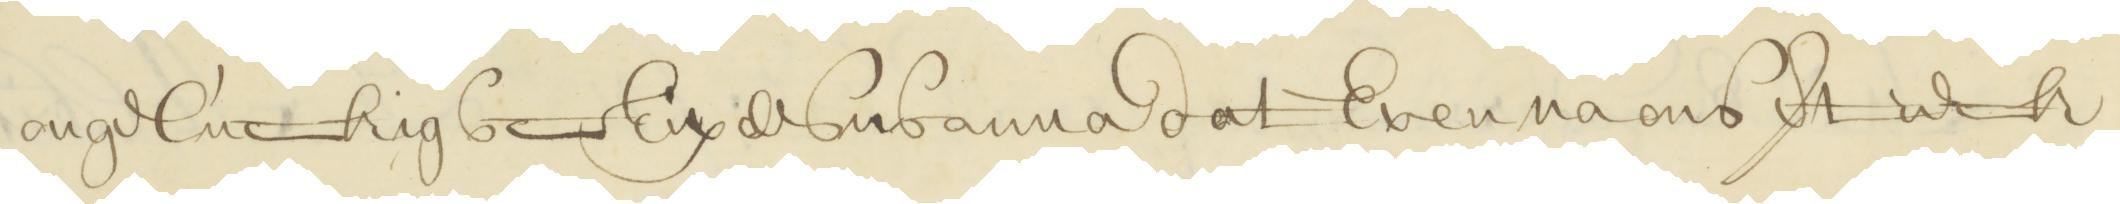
ongeluckig schip de susanna dat Even na ons vertreck
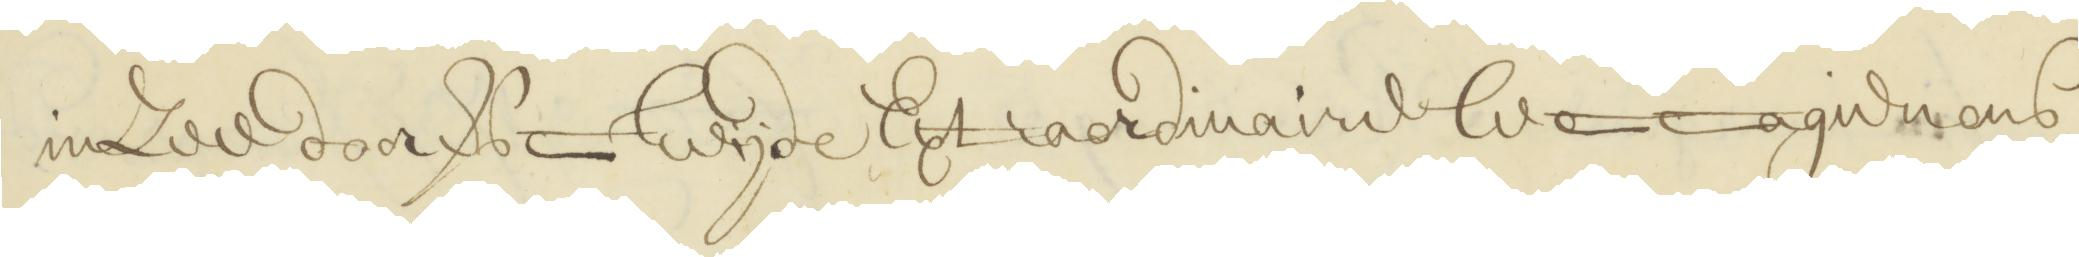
in zee door verscheijde Extraordinaire leccagien ons
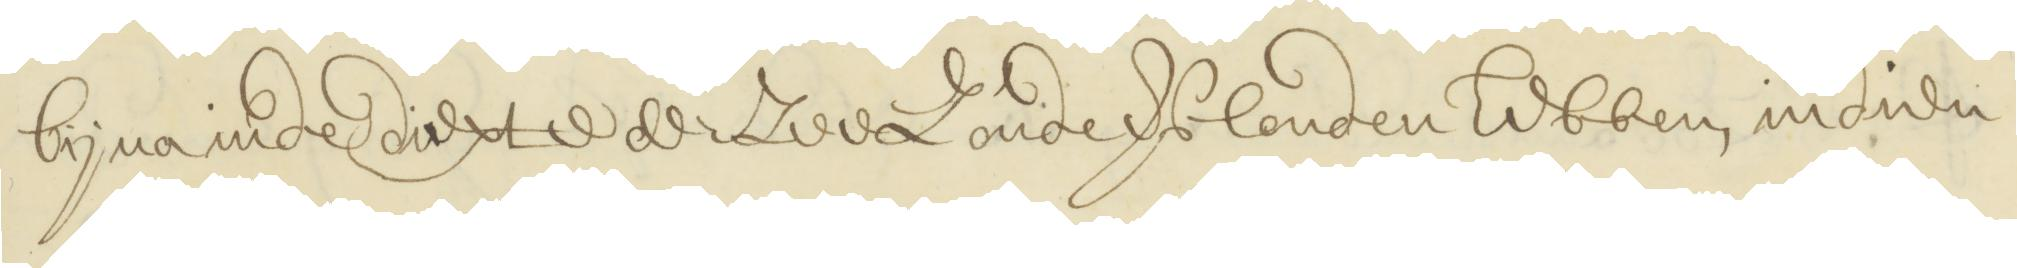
bij na inde diepte der zee zoude verslonden hebben, in dien
